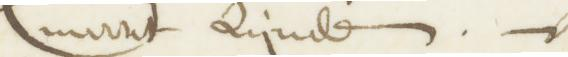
meert zijnde. —
